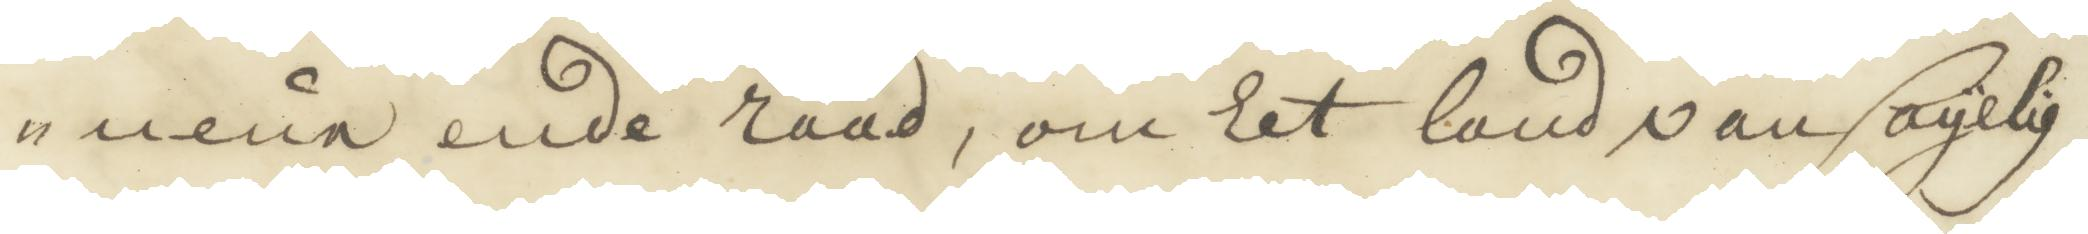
„neur ende raad, om het land van Caijelij
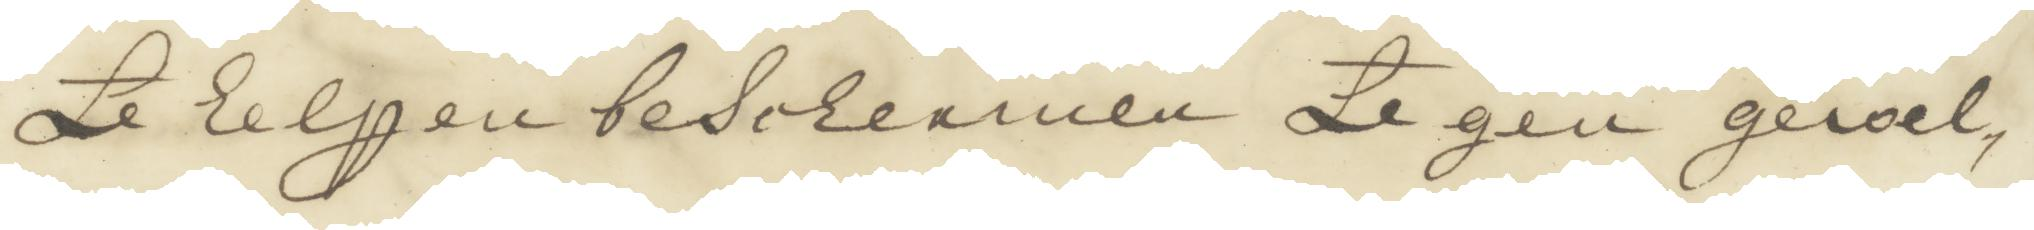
te helpen beschermen tegen gewel„
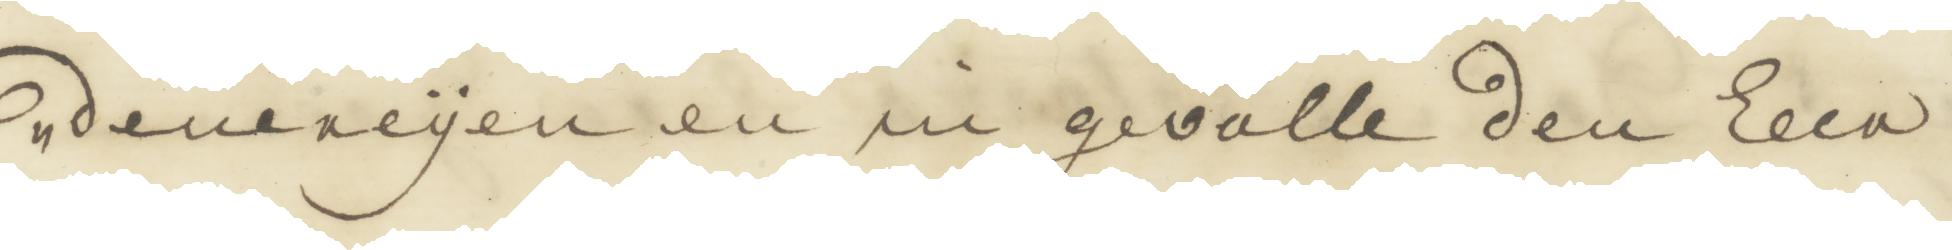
denereijen en in gevalle den heer
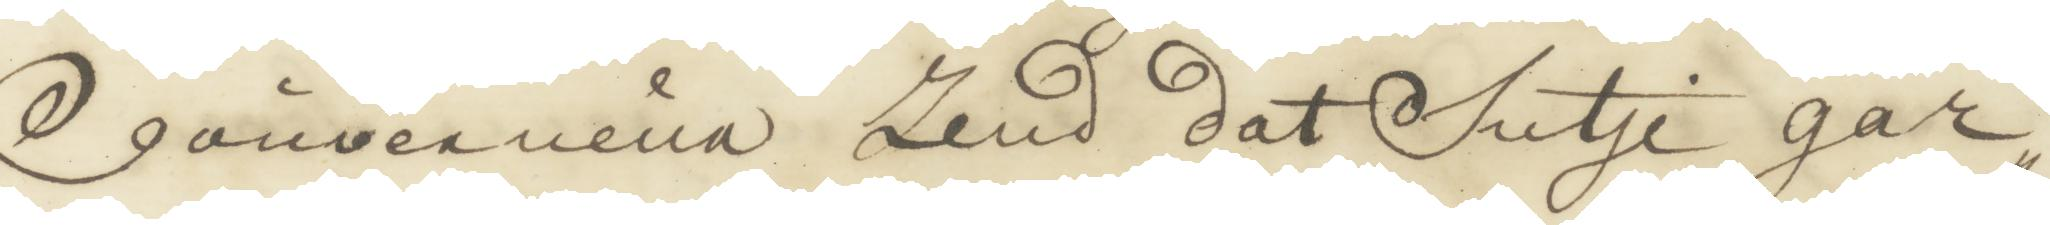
gouverneur zend dat Intje gar„
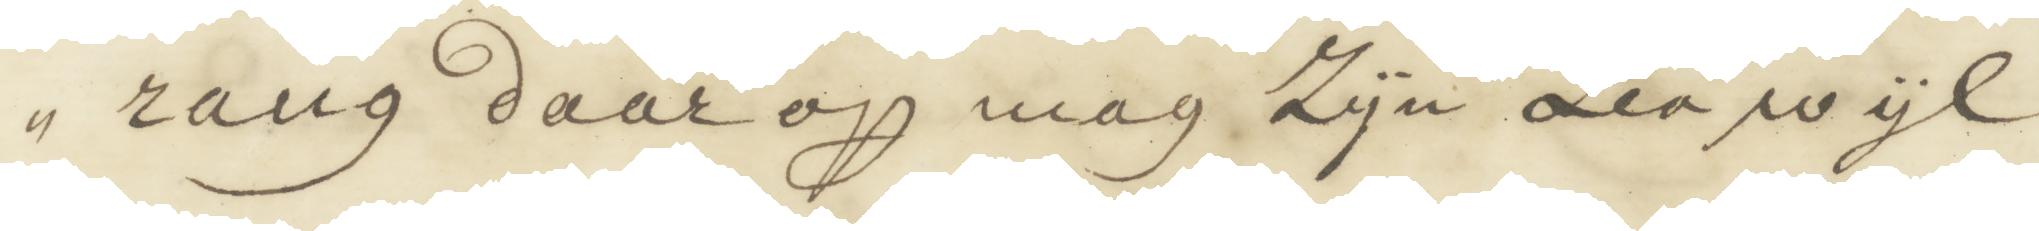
„rang daar op mag zijn terwijl
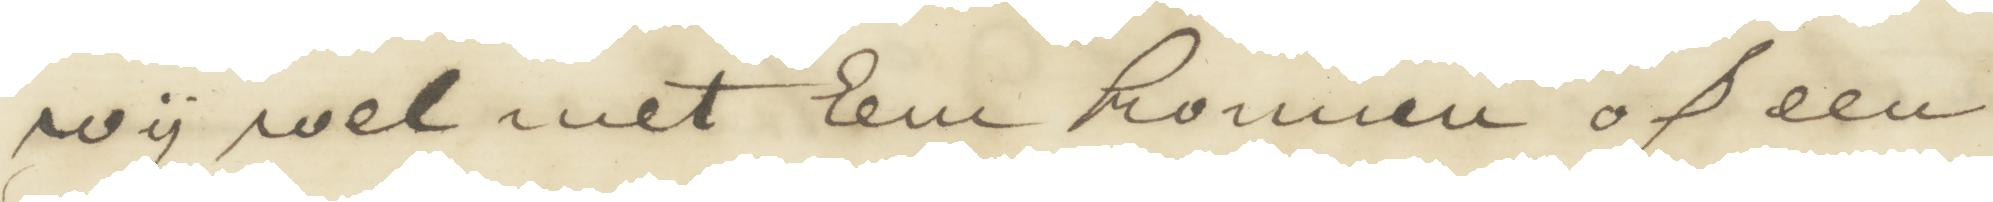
wij wel met hem konnen over een
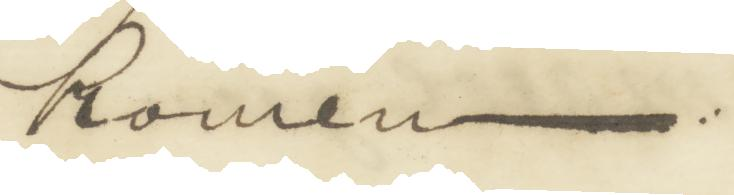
komen:
